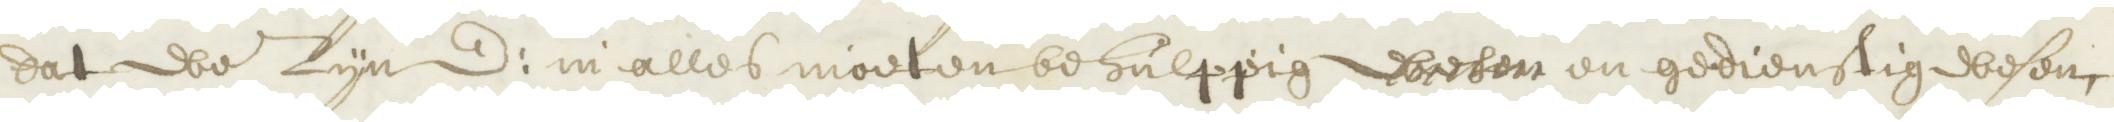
dat we zijn E: in alles moeten behulppig wesen en gedienstig wesen,
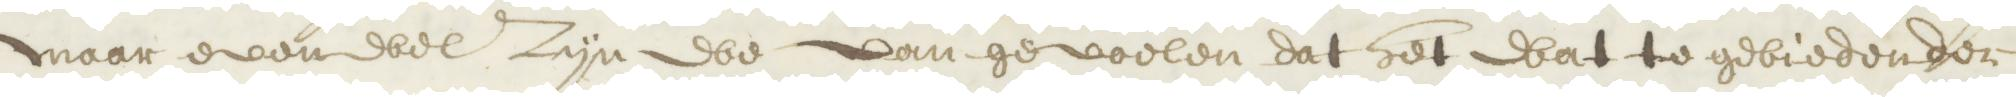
maar evenwel zijn we van gevoelen dat het wat te gebieden der
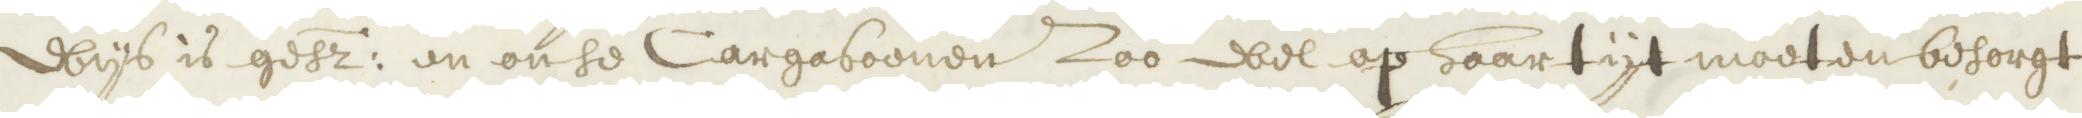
wijs is gesz: en onse Cargasoenen zoo wel op haar tijt moeten besorgt
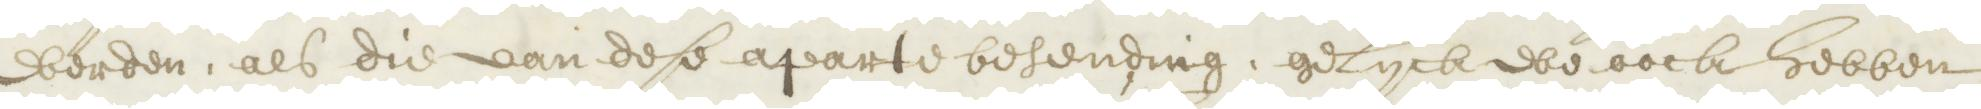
werden, als die van dese aparte besending, gelijck we oock hebben
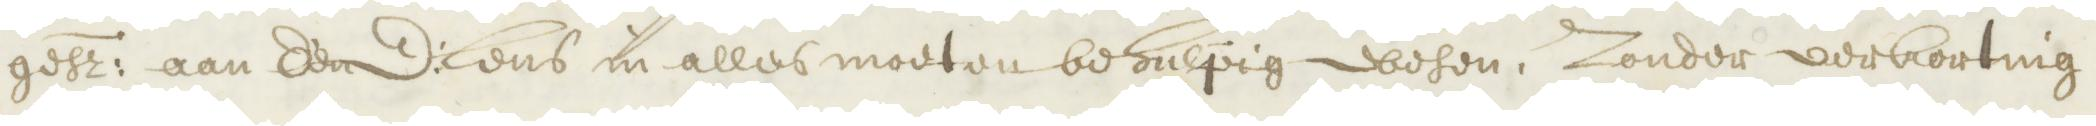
gesz: aan den E:lens in alles moeten behulpig wesen, zonder verkorting
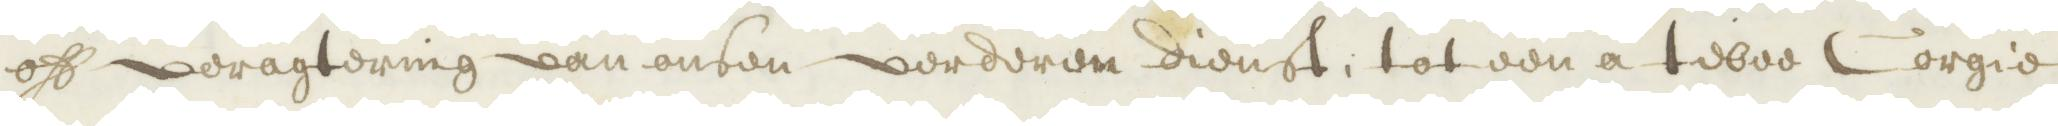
off veragtering van onsen verderen dienst; tot een â twee Cargie
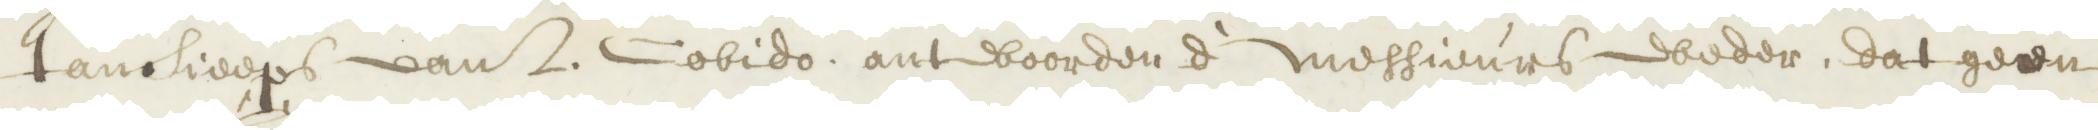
tansieeps van 2. Cobido. antwoorden d' messieurs weder, dat geen
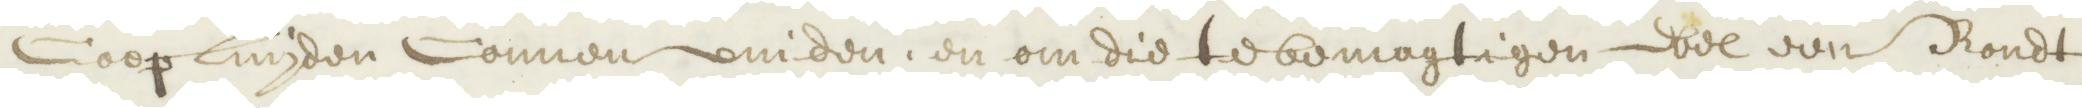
coopluijden connen vinden, en om die te bemagtigen wel een Rondt
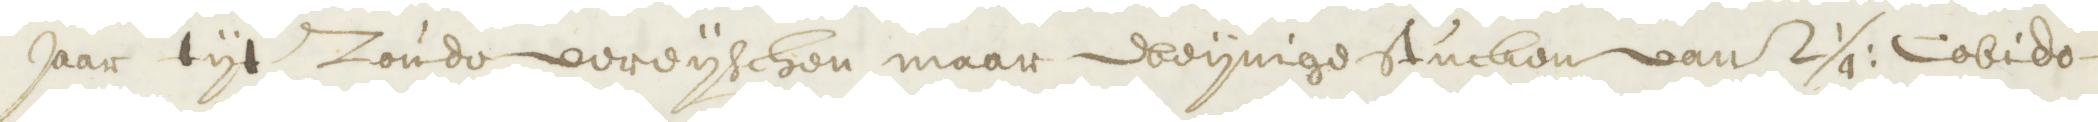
Jaar tijt zoude vereijschen maar weijnige stucken van 2¼: Cobido
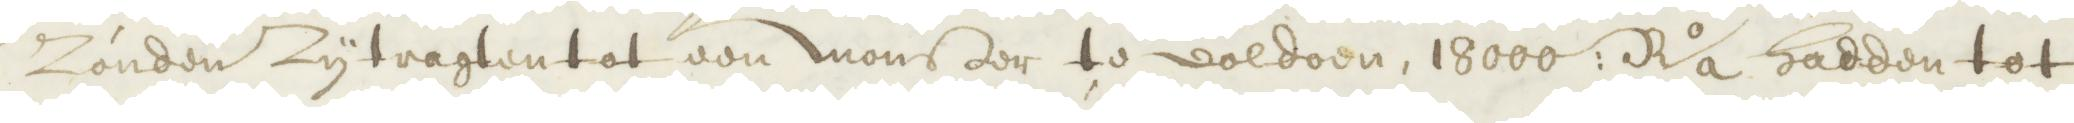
zouden zij tragten tot een monster te voldoen, 18000: R o/a hadden tot
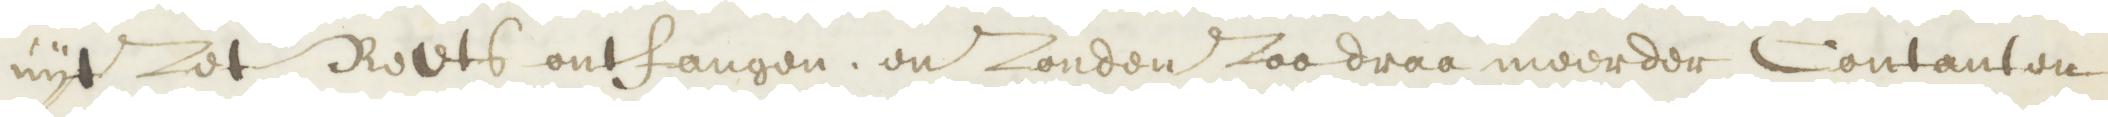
uijtzet Reets ontfangen, en zouden zoodraa meerder contanten
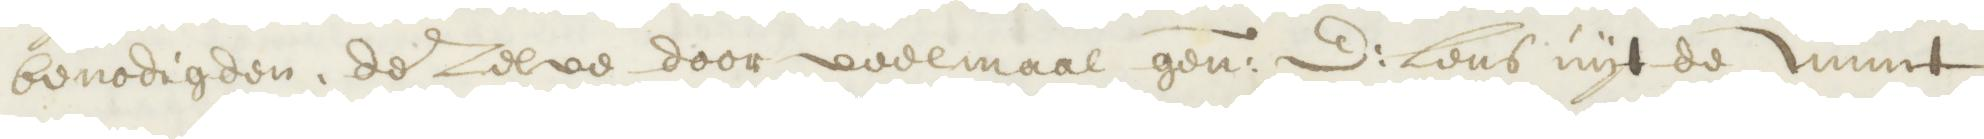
benodigden, dezelve door veelmaal gen: E:lens uijt de munt
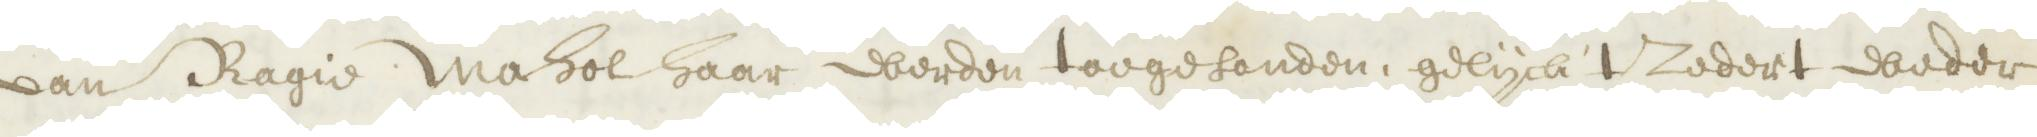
van Ragie Mahol haar werden toegesonden, gelijck ’t zedert weder
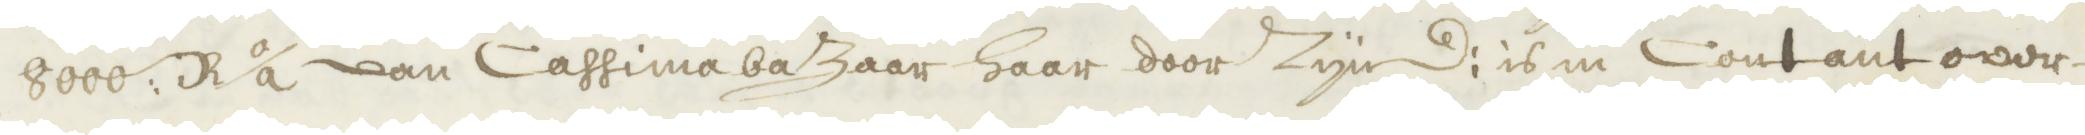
8000: R o/a van Cassima baZaar haar door zijn E: is in contant over
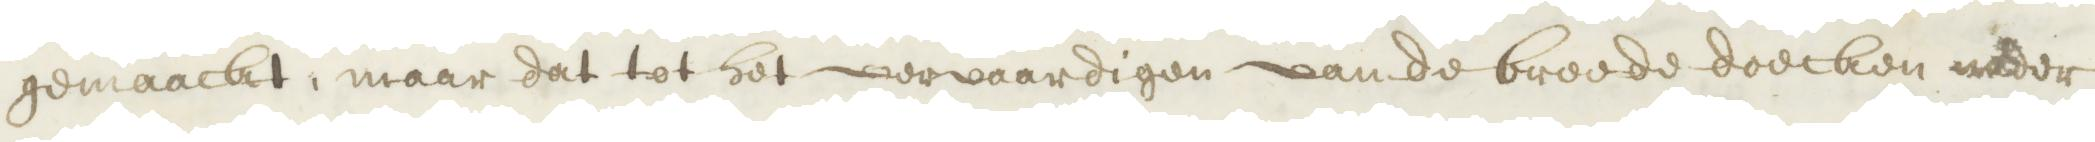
gemaackt, maar dat tot het vervaardigen van de breede doecken nader
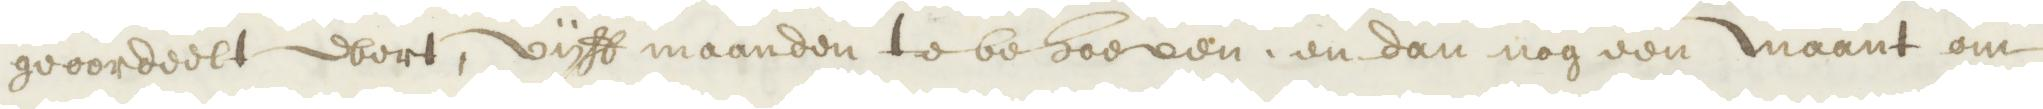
geoordeelt wert, vijff maanden te behoeven, en dan nog een maant om
